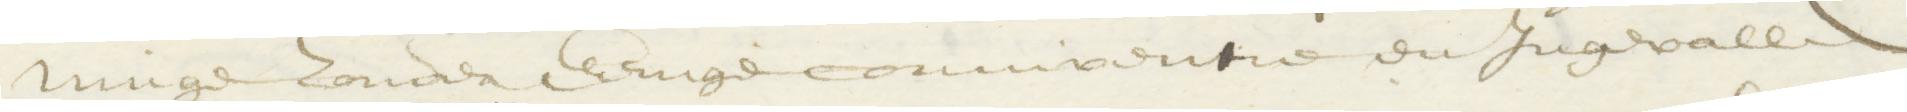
ninge zonder Eenige conniventie en Jngevalle
